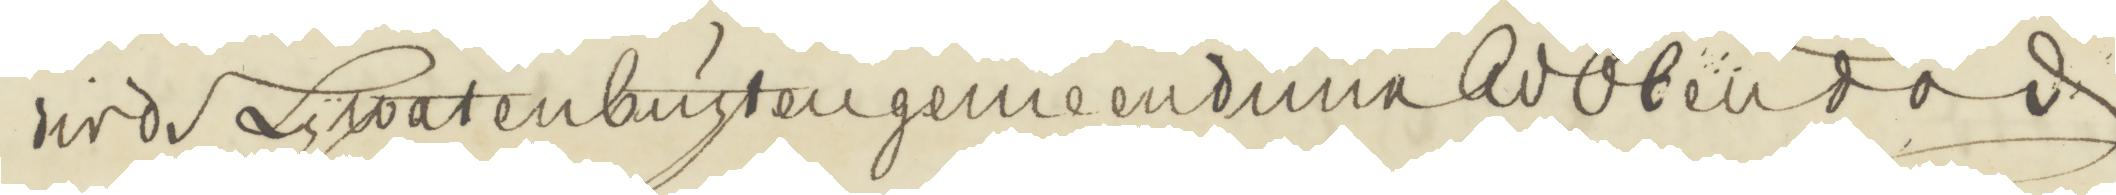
die de Lijwaten buytengemeen duur hebben doen
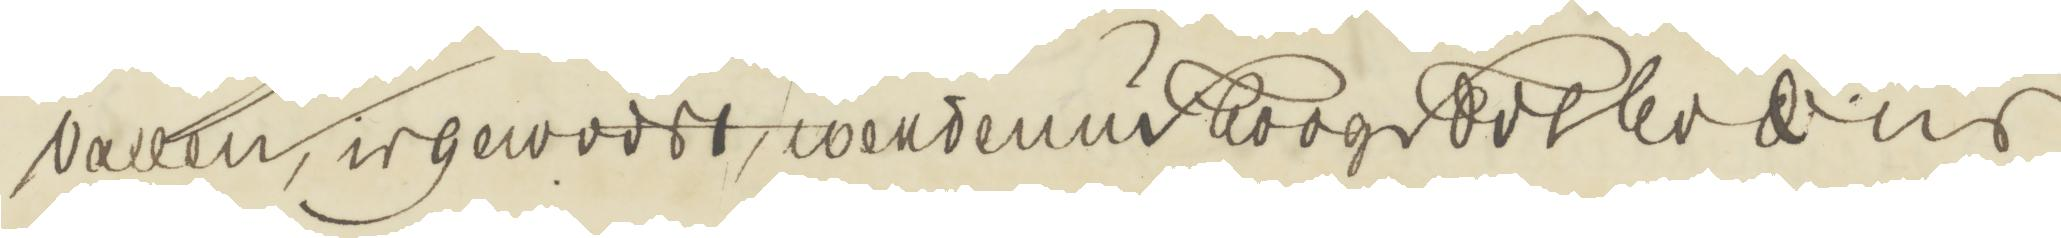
vallen, is geweest, werden uE hoog Edelhedens
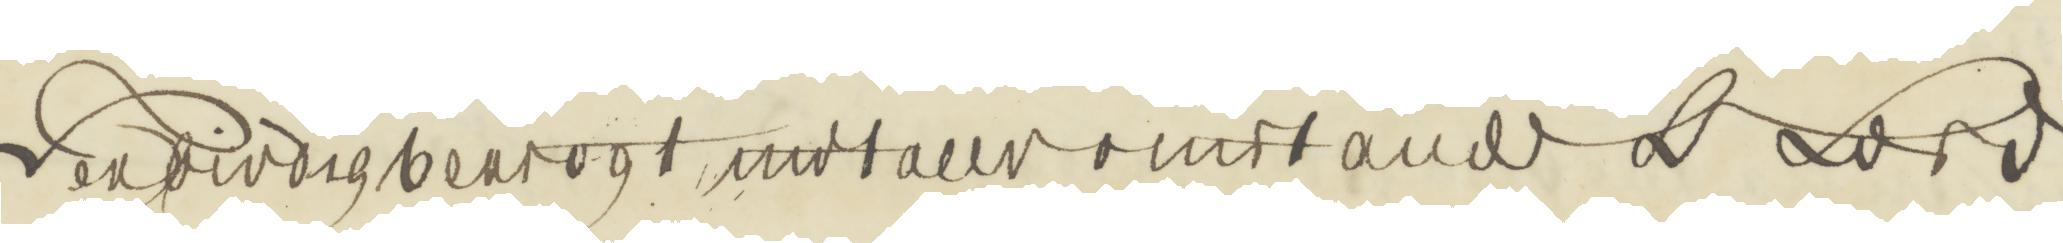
Eerbiedig versogt, met alle omstande te Lesen
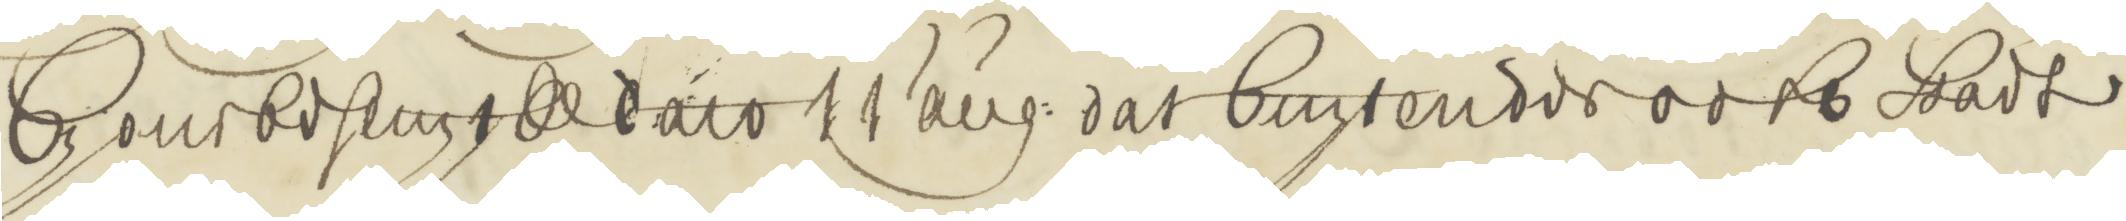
bij ons besluyt de dato 11' aug: dat buyten des ook hadt
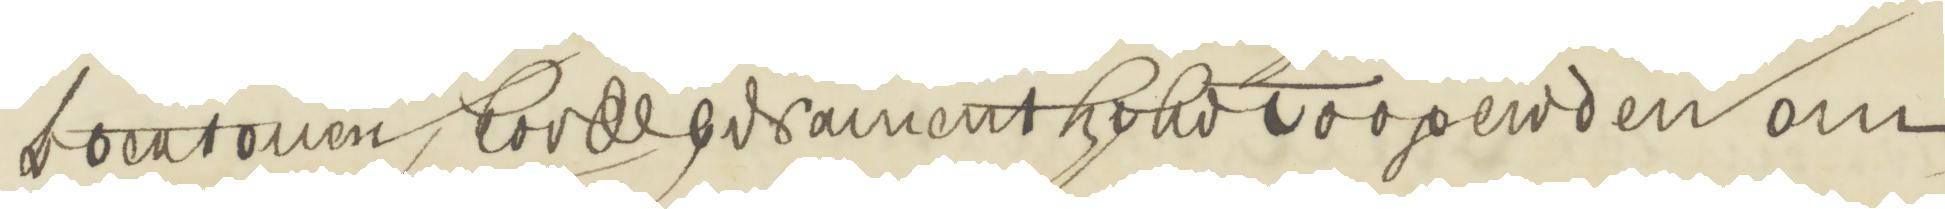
te vertonen, hoe de gesamentlyke Cooplieden om
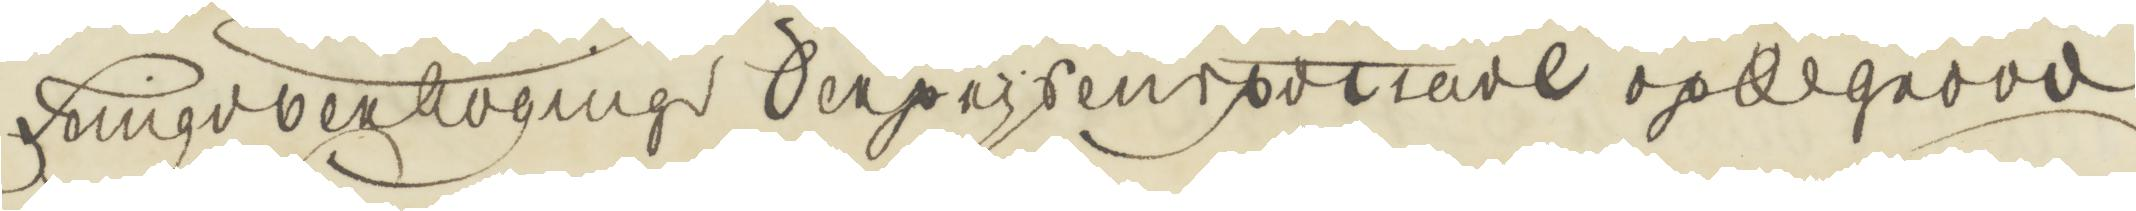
Eenige verhoginge der prijsen speciael op de grove
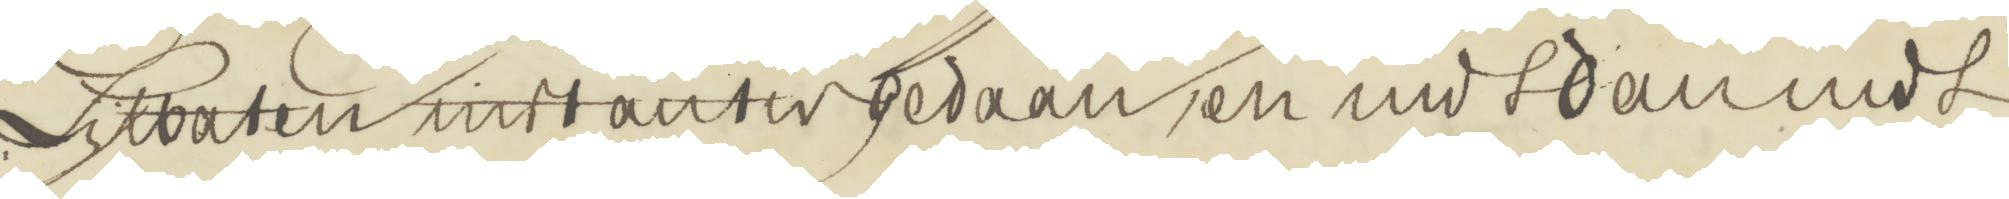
Lijwaten instantie gedaan, en niet dan met
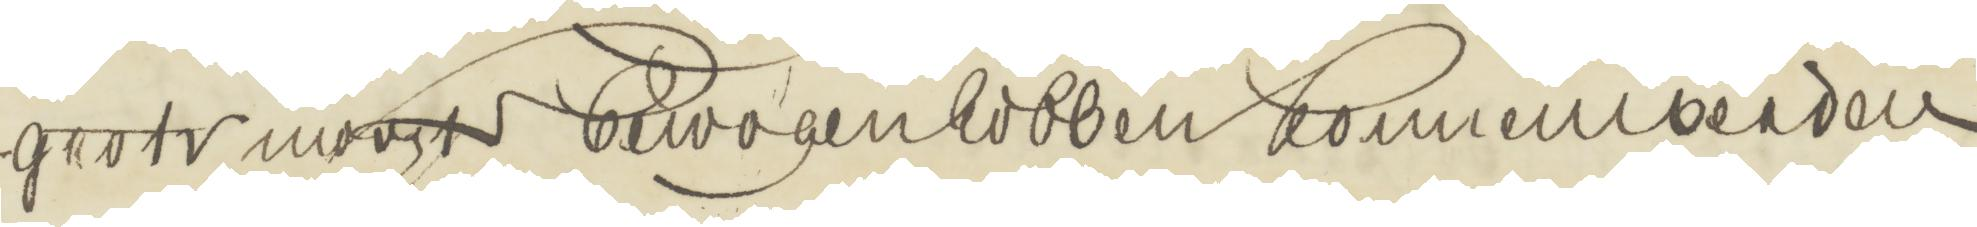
grote moeyte bewogen hebben konnen werden
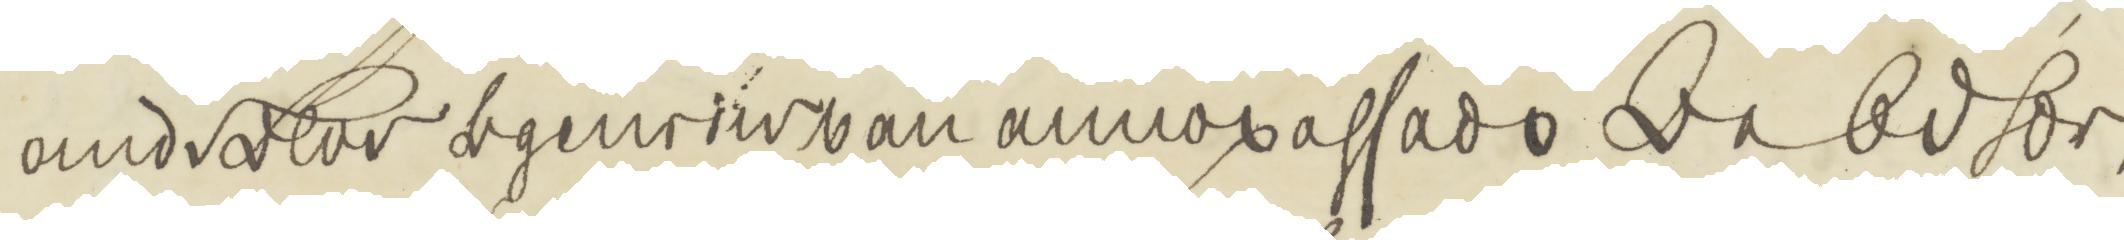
om deselve tegenstie van anno passado ter besor
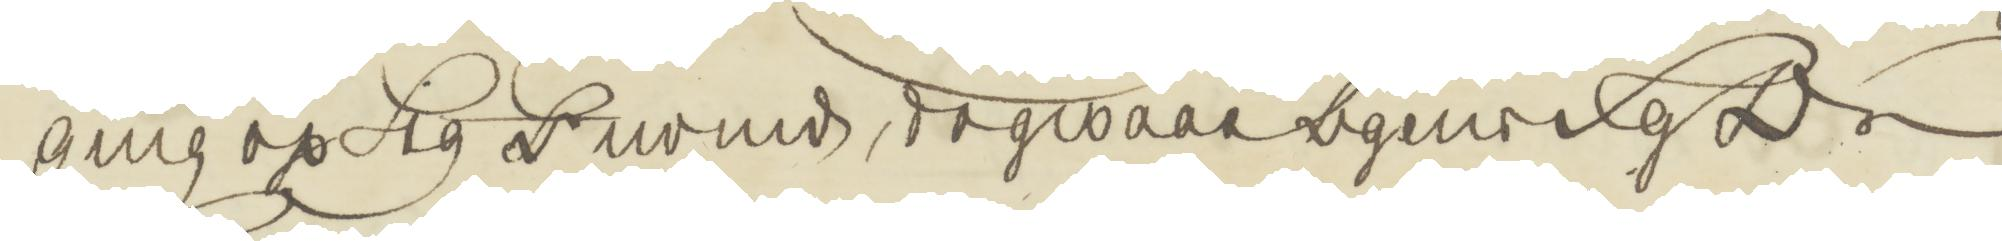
ging op sig te nemen, dog waar tegens Egter
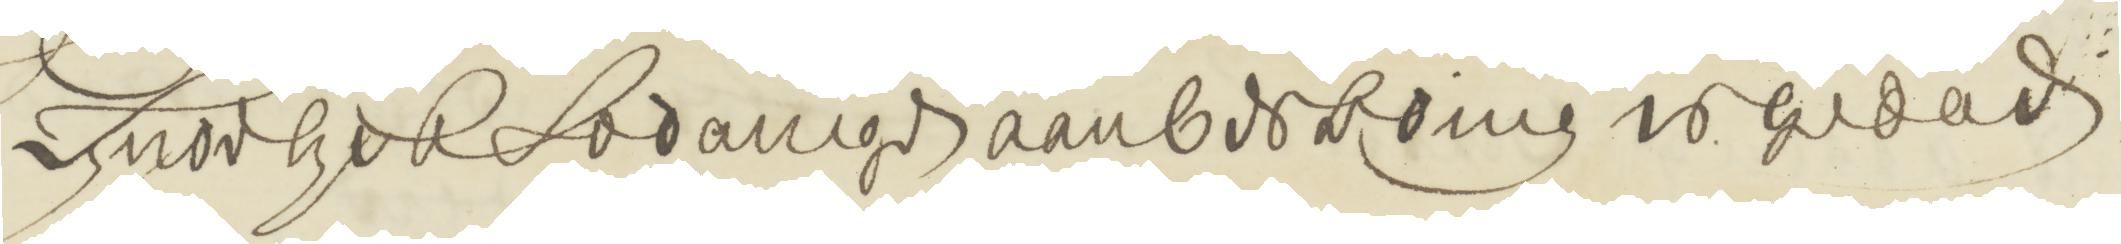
Eyndelyk sodanigen aanbesteding is gedaen
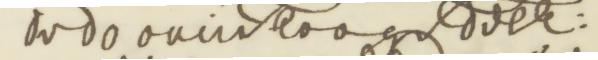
de door uE hoog Edelh:
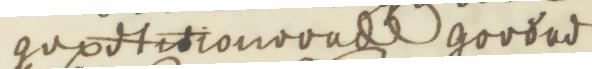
gepetitioneerde goedren
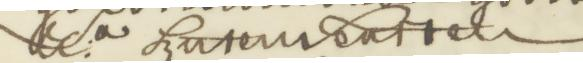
et:a Laten Eersten
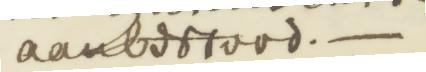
aanbesteed.
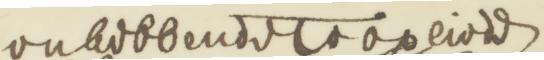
en hebben de Cooplieden
